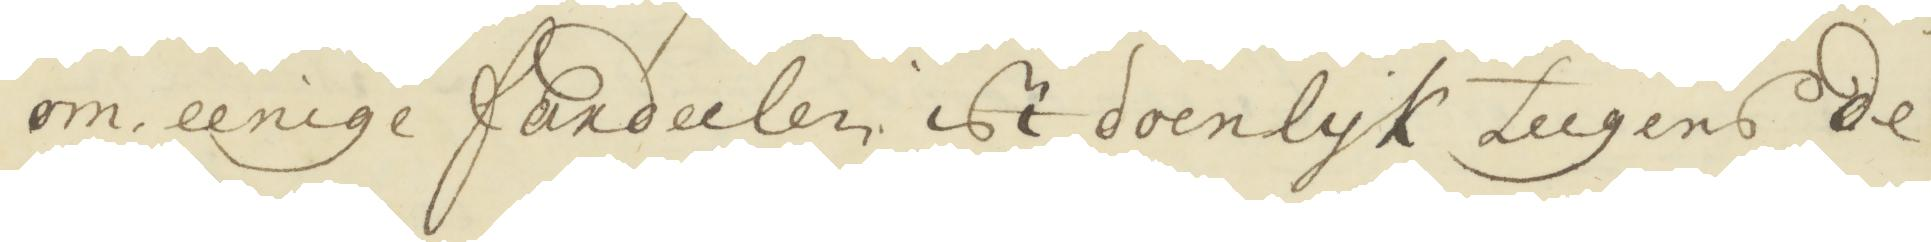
om eenige fardeelen ist doenlijk teegens de
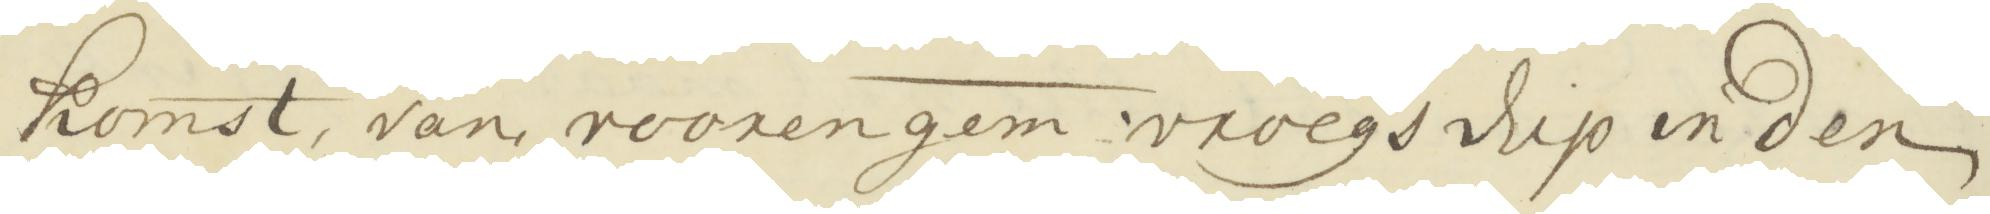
komst, van vooren gem: vroegschip in den
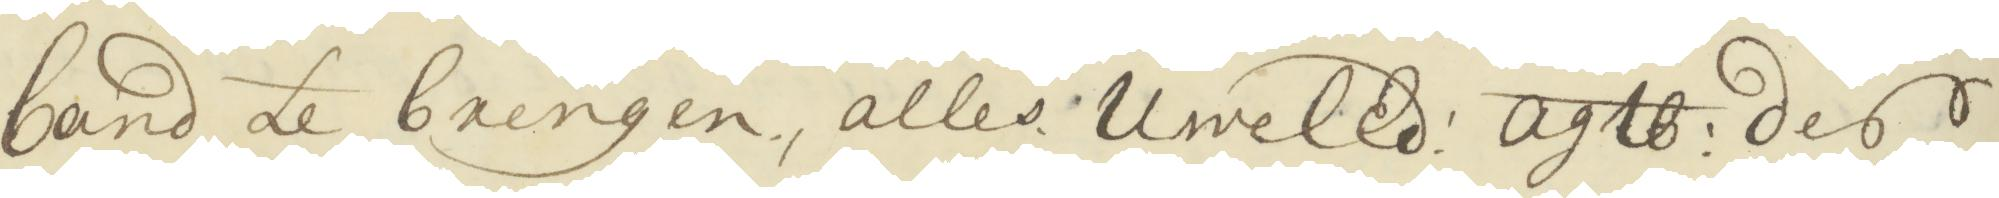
band te brengen, alles UwelEd: agtb: des
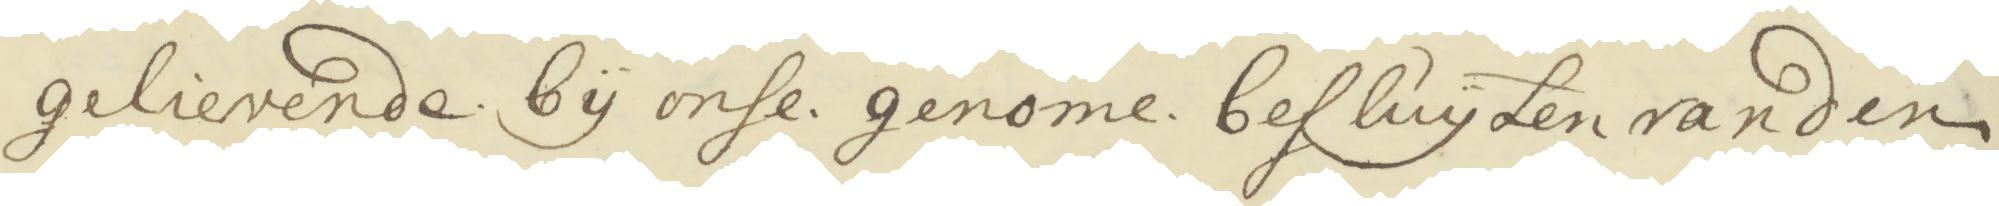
gelievende bij onse genome besluijten van den
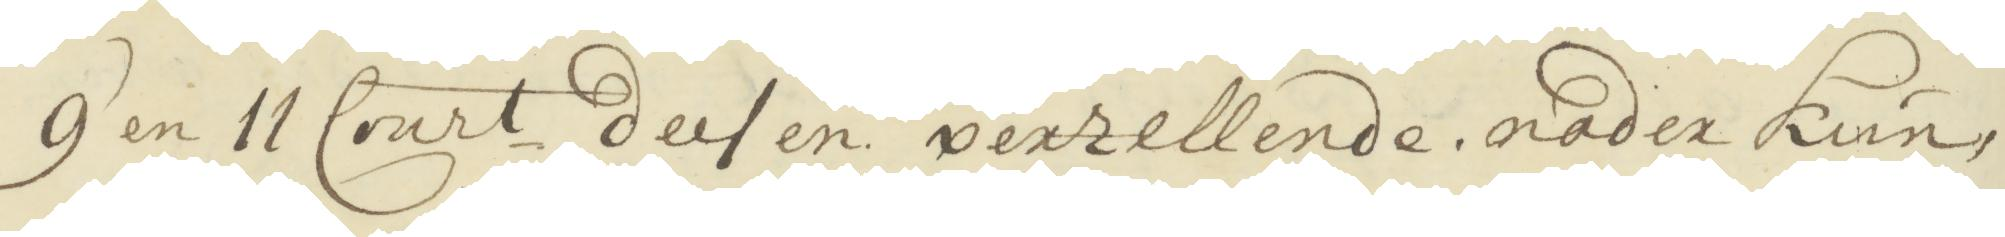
9’ en 11 Court deesen verzellende nader kun„
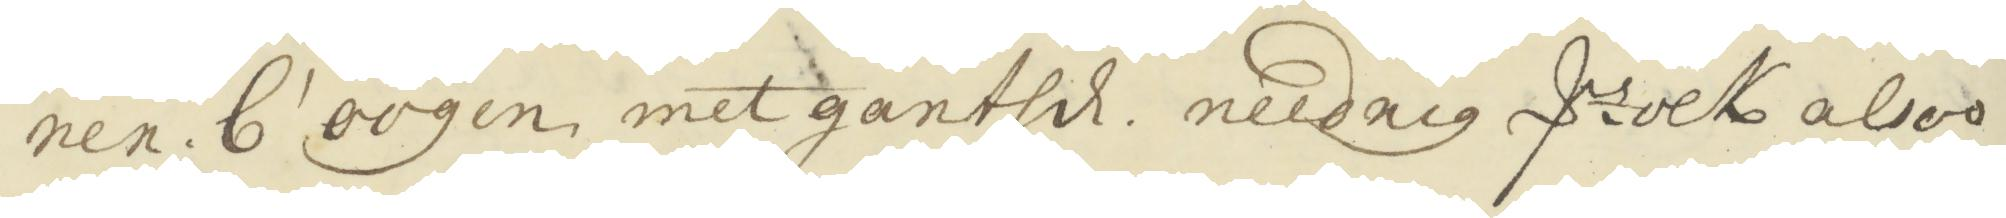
nen b'oogen met gantsch needrig verzoek alsoo
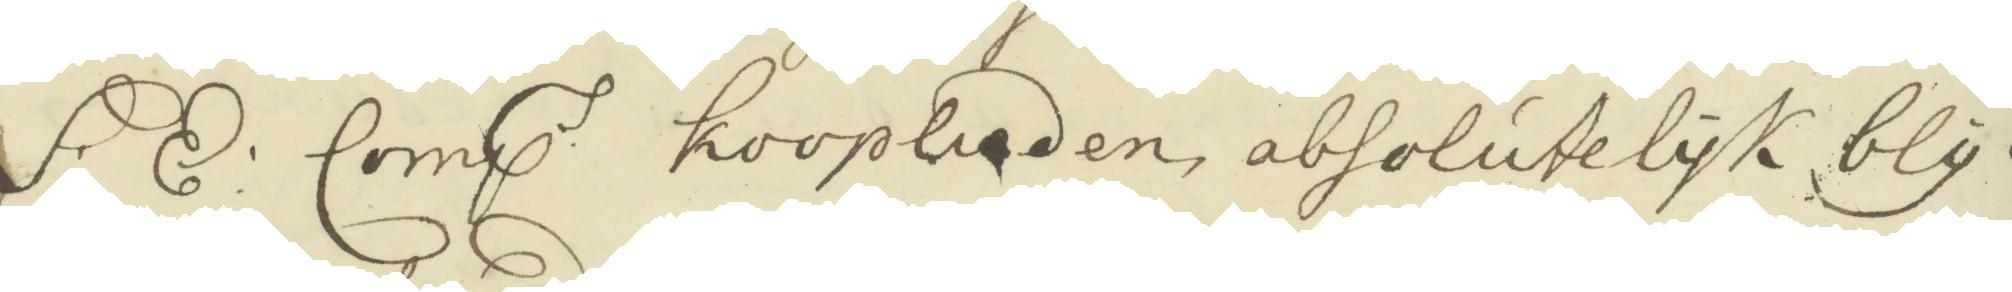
S: E: Comp:s kooplieden absolutelijk blij„
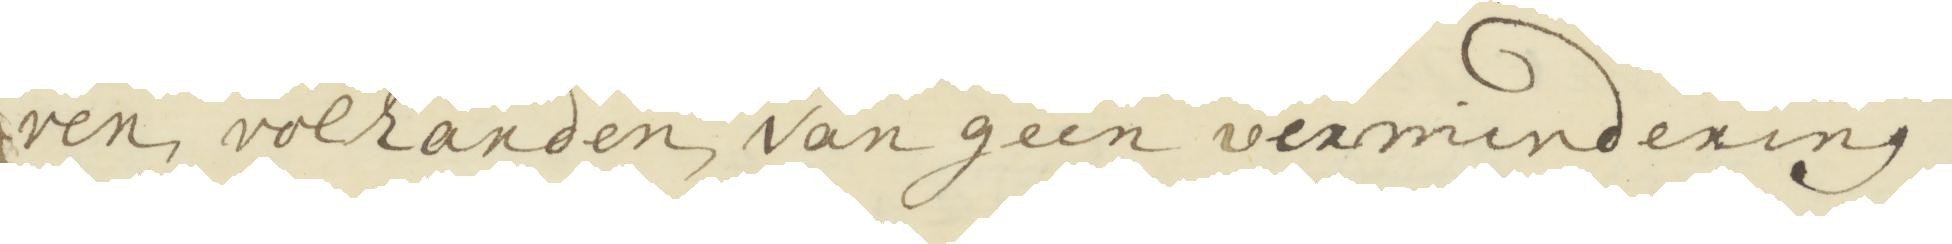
ven volharden van geen vermindering
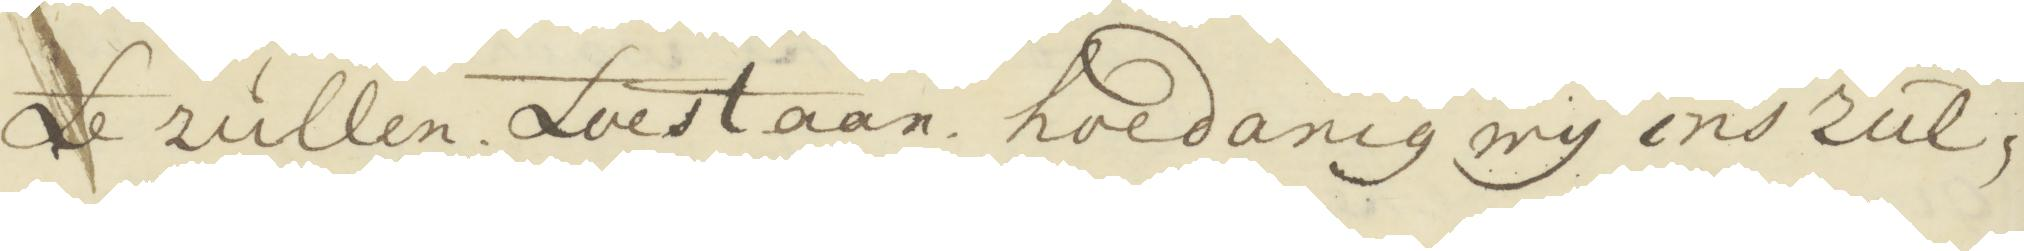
te zullen toestaan hoedanig wij ons zul„
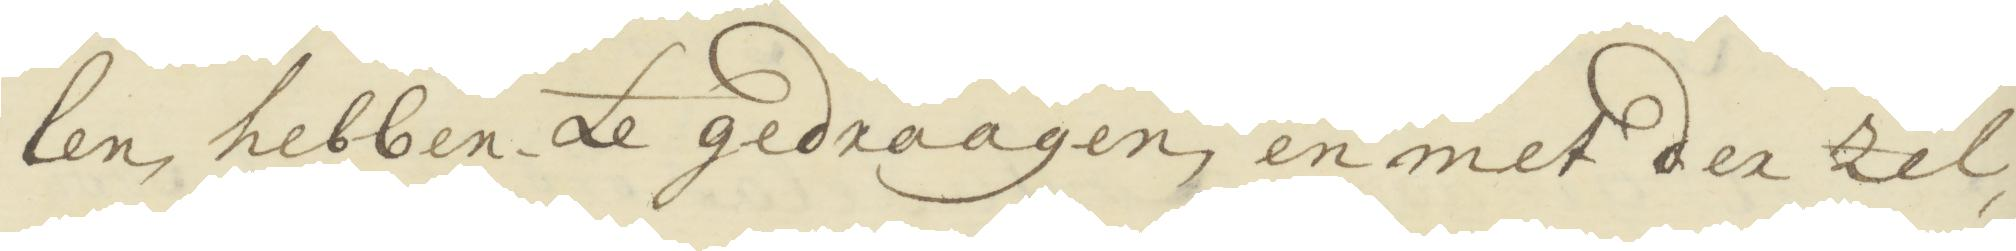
len hebben te gedraagen en met der zel„
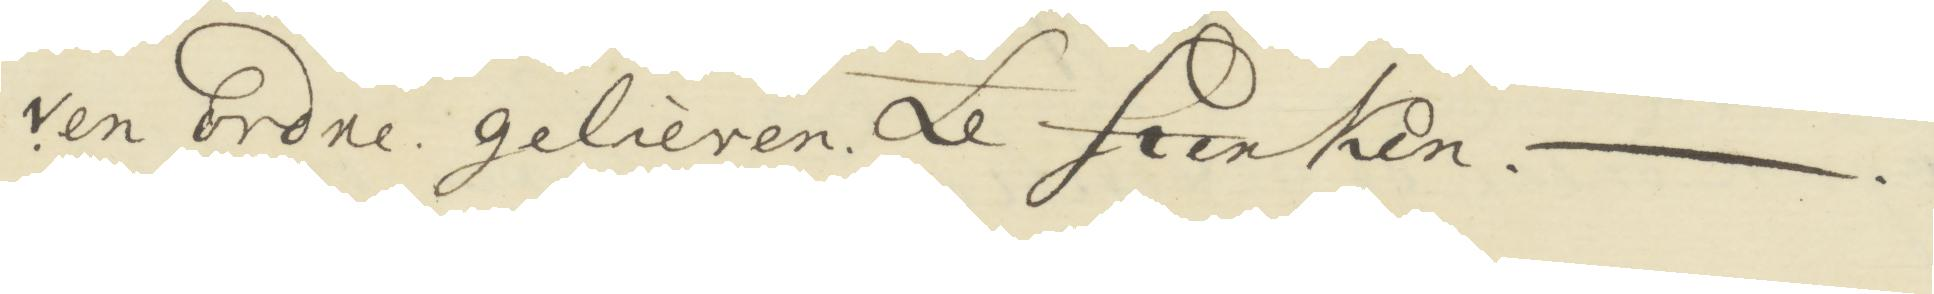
ven ordre gelieven te sterken. —.
